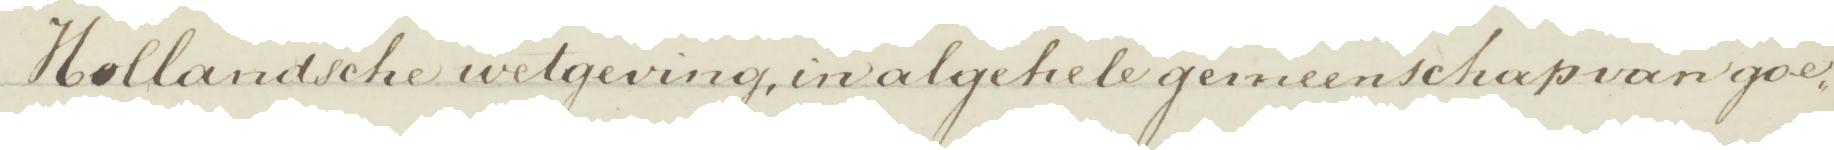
Hollandsche wetgeving, in algehele gemeenschap van goe„
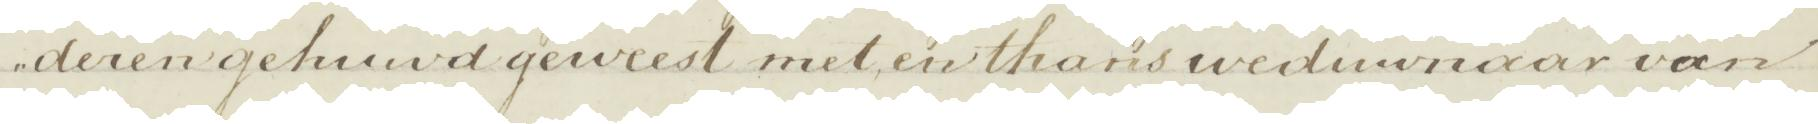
„deren gehuwd geweest met, en thans weduwnaar van
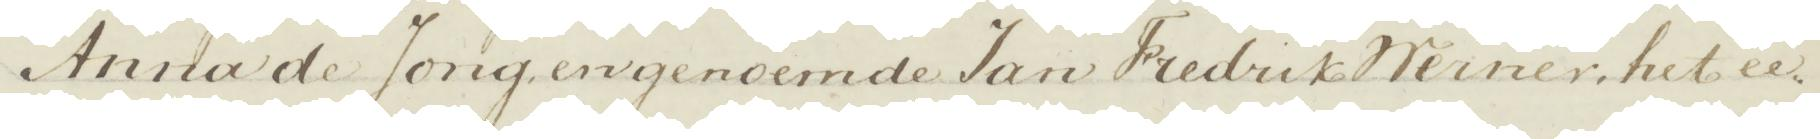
Anna de Jong, en genoemde Jan Fredrik Werner, het ee„
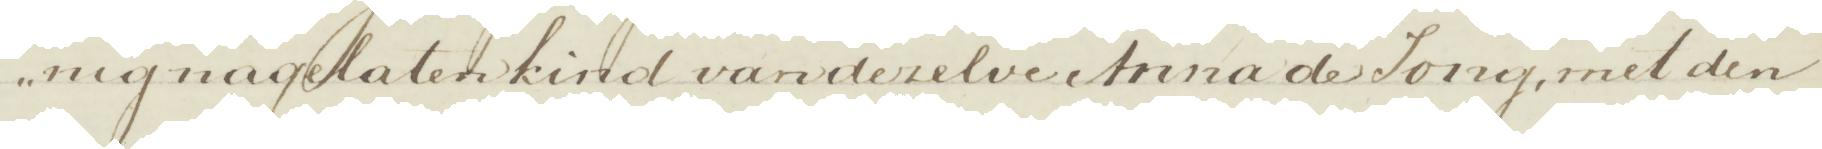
„nig nagelaten kind van dezelve Anna de Jong, met den
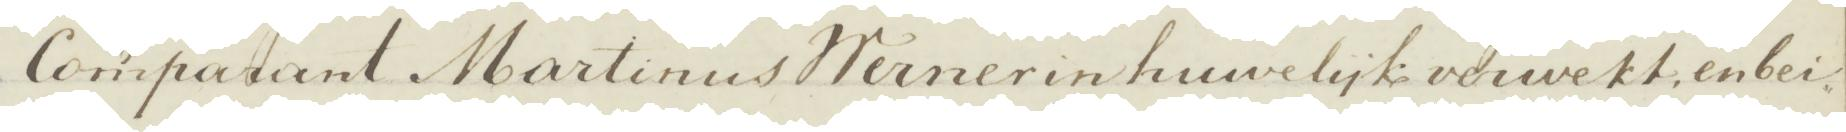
Comparant Martinus Werner in huwelijk verwekt, en bei„
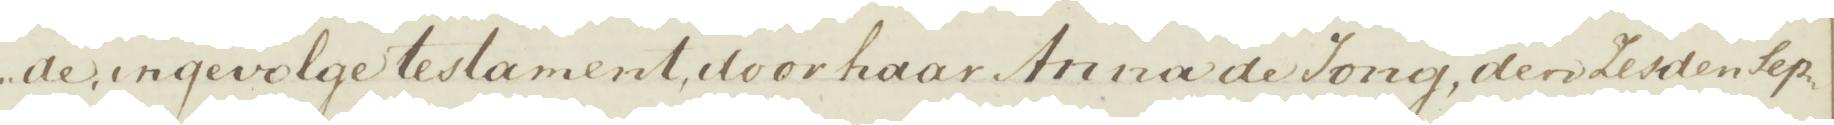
„de, ingevolge testament, door haar Anna de Jong, den Zesden sep
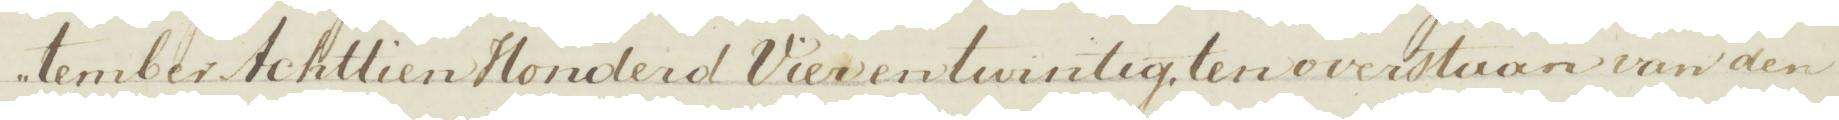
„tember Achttien Honderd Vier en twintig, ten overstaan van den
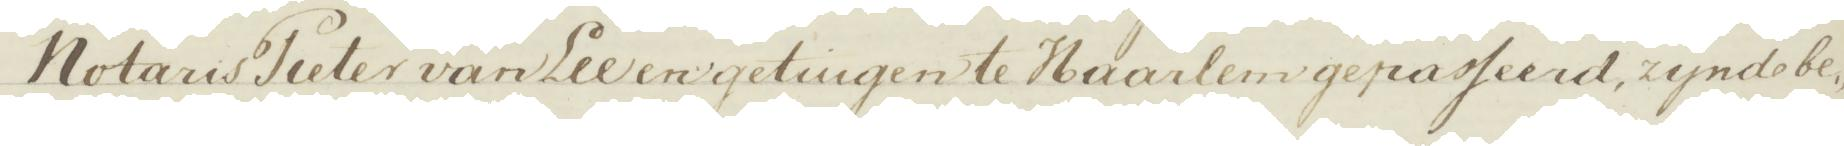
Notaris Pieter van Lee en getuigen te Haarlem gepasseerd, zijnde be
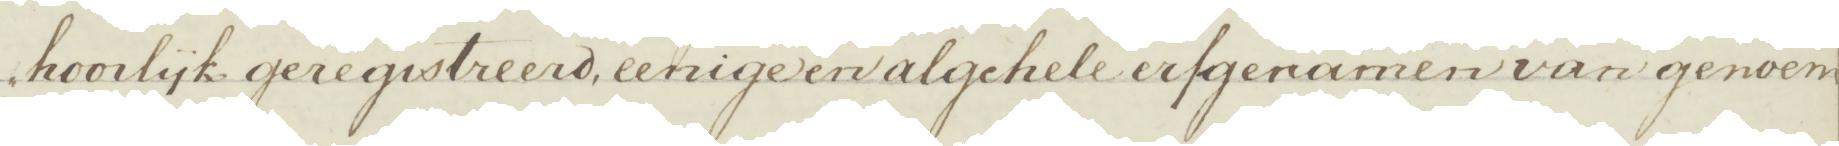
„hoorlijk geregistreerd, eenige en algehele erfgenamen van genoem
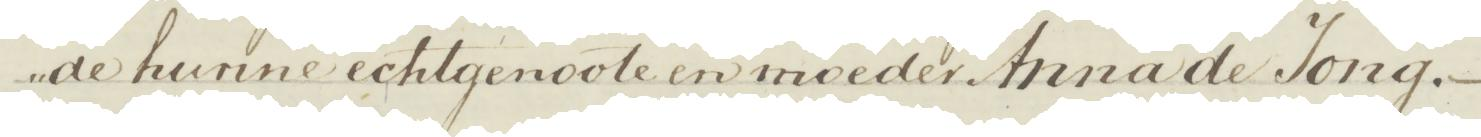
„de hunne echtgenoote en meeder Anna de Jong.
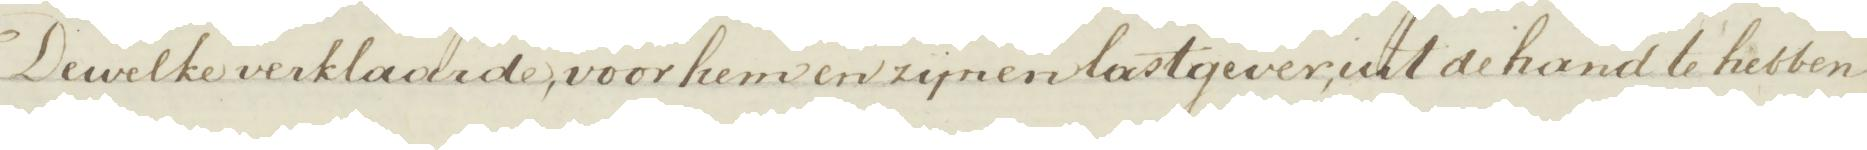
Dewelke verklaarde, voor hem en zijnen last gever, uit de hand te hebben
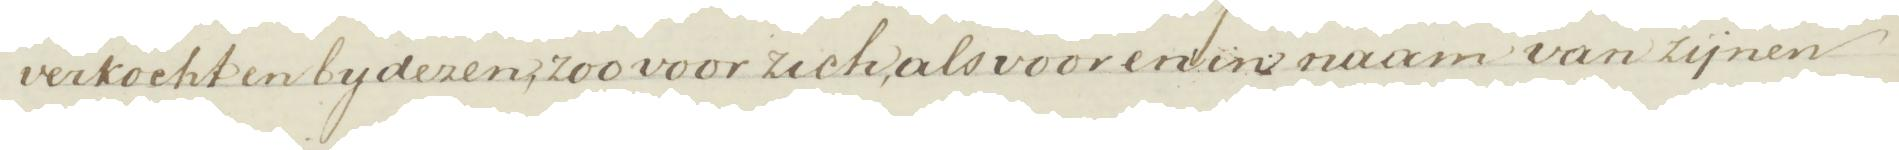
verkocht en bij dezen, zoo voor zich, als voor en in naam van zijnen
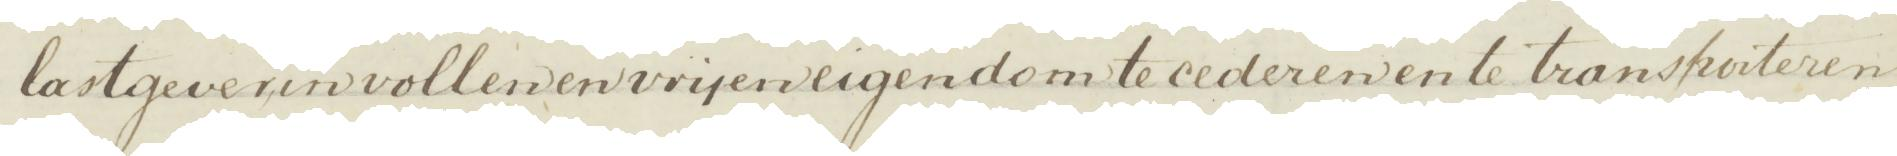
lastgever, in vollen en vrijen eigendom te cederen en te transporteren
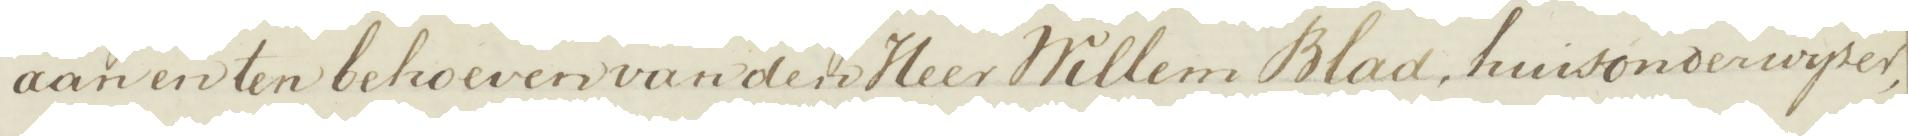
aan en ten behoeven van den Heer Willem Blad, huisonderwijzer,
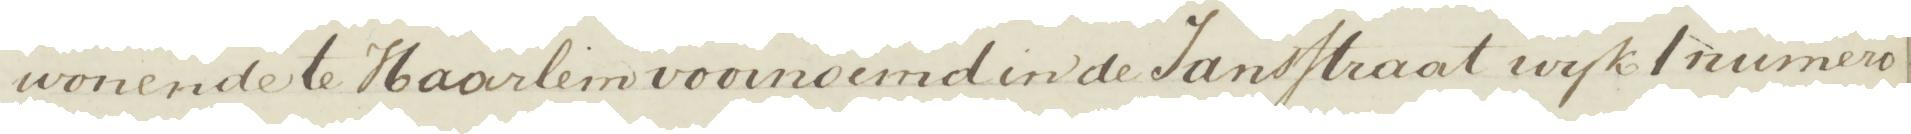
wonende te Haarlem voornoemd in de Jansstraat wijk 1 numero
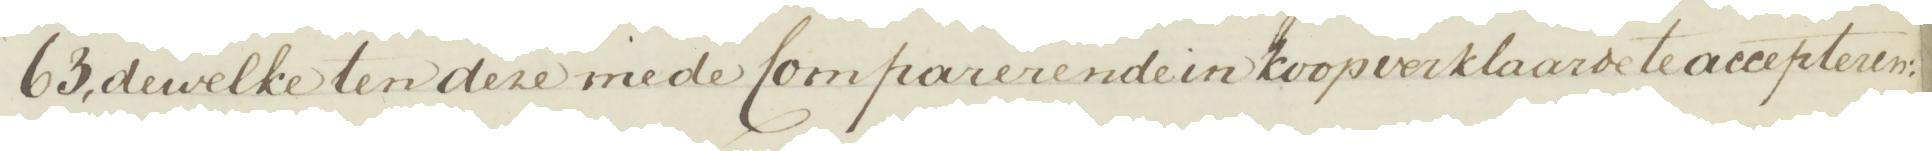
63, dewelke ten deze mede Comparerende in koop verklaarde te accepteren:
